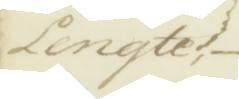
Lengte,-
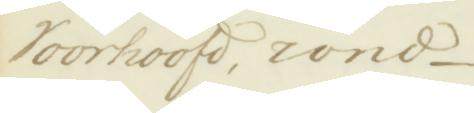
Voorhoofd, rond_
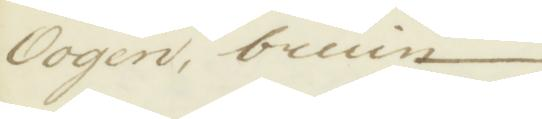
Oogen, bruin
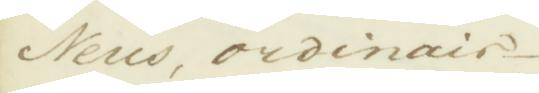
Neus, ordinair
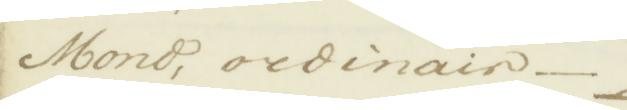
Mond, ordinair—
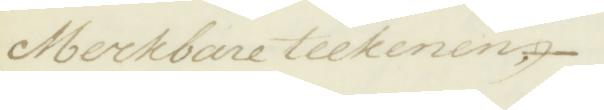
Merkbare teekenen,-
